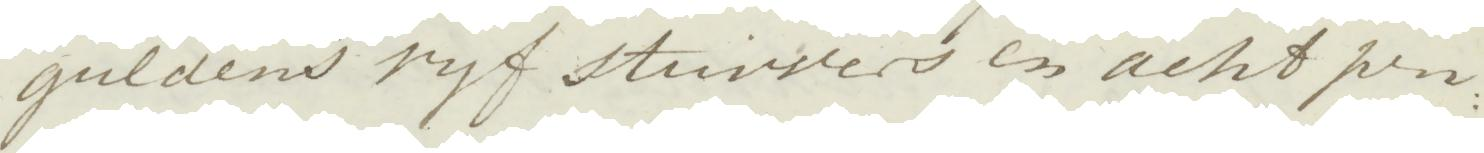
guldens vyf stuivers en acht pen
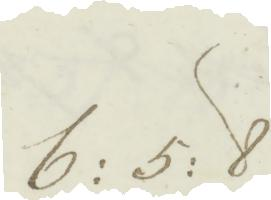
6.5.8
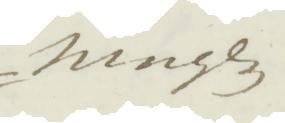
=ningen
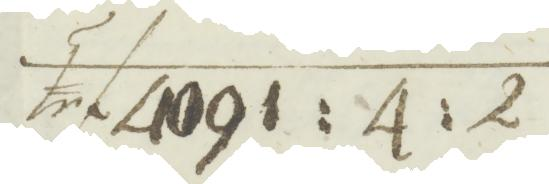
Tr ƒ 4091 : 4 : 2
